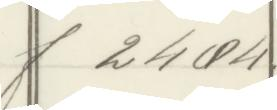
ƒ 2484
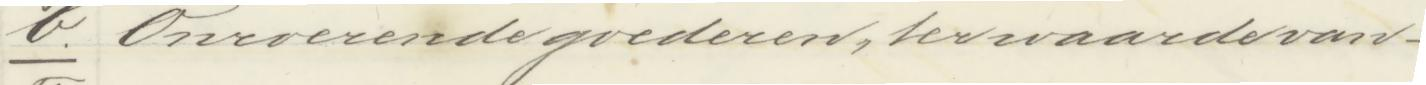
b. Onroerende goederen, ter waarde van-
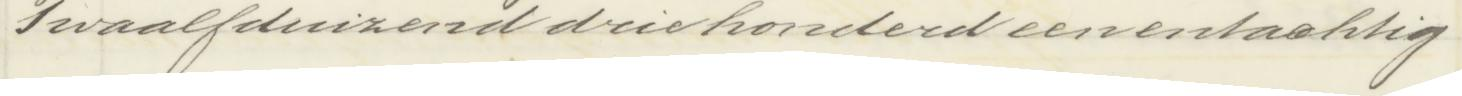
Twaalf duizend drie honderd een entachtig
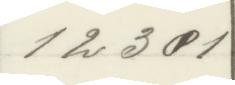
12381
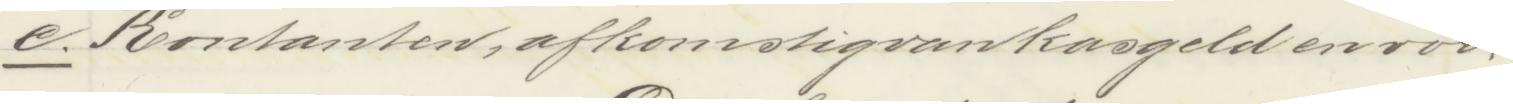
c. Kontanten, afkomstig van kasgeld en vor„
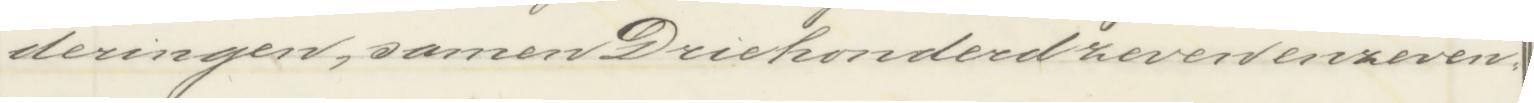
deringen, zamen Driehonderd zeven en zeven„
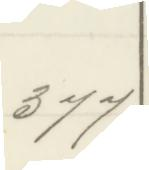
377.
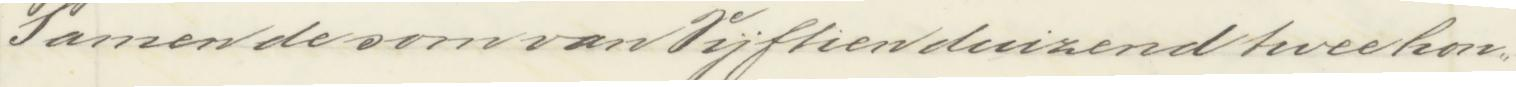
Samen de som van Vijftien duizend twee hon„
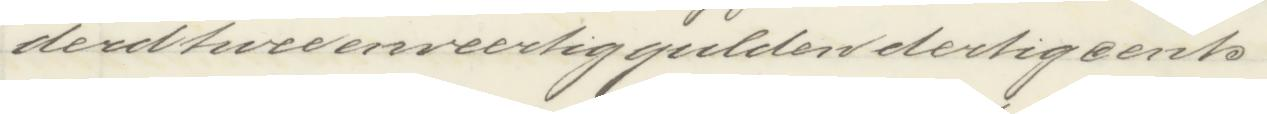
derd twee enveertig gulden dertig cents
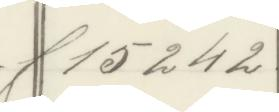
ƒ15242
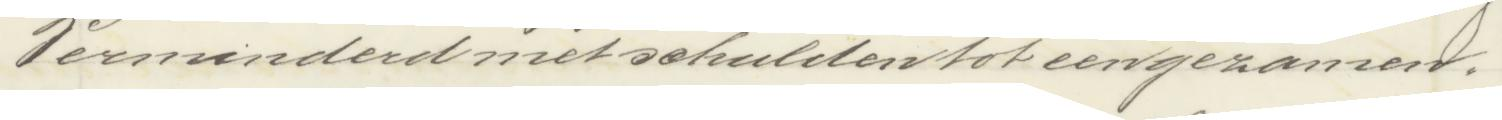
Verminderd met schulden tot een gezamen„
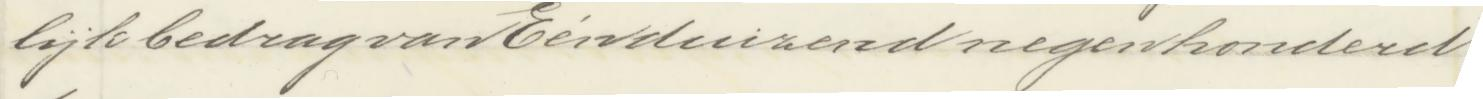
lijk bedrag van Eén duizend negen honderd
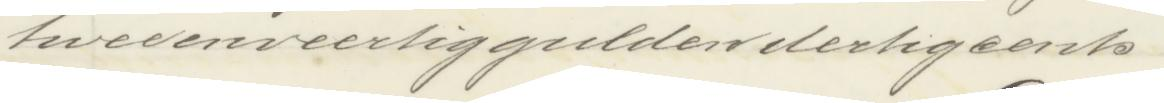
twee enveertig gulden dertig cents
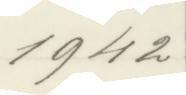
1942
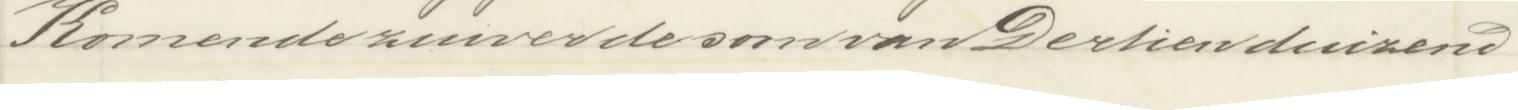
Komende zuiver de som van Dertien duizend
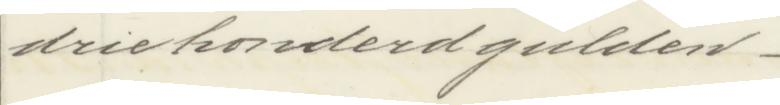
drie honderd gulden-
